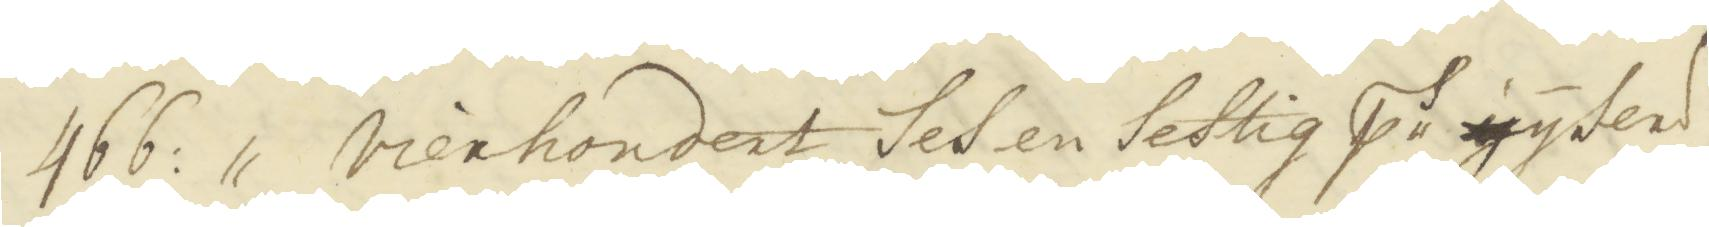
466: „ vierhondert ses en sestig p„s ijijsers
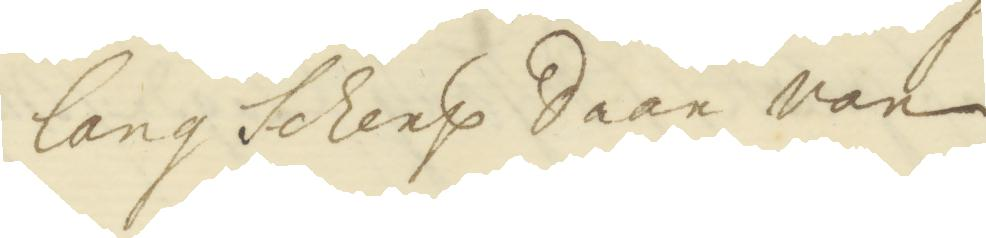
lang scherp daar van
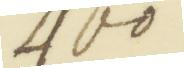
460
